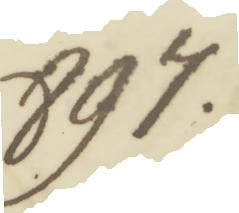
897.
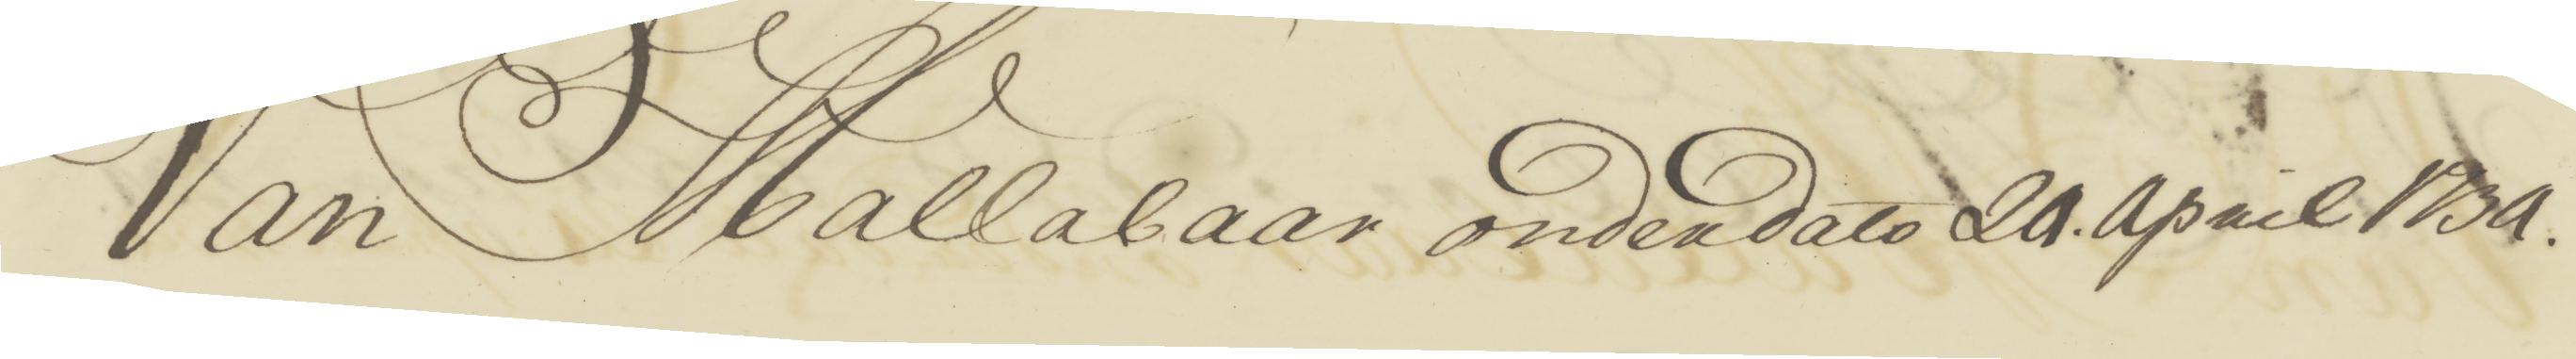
Van Mallabaar onder dato 24. April 1734.
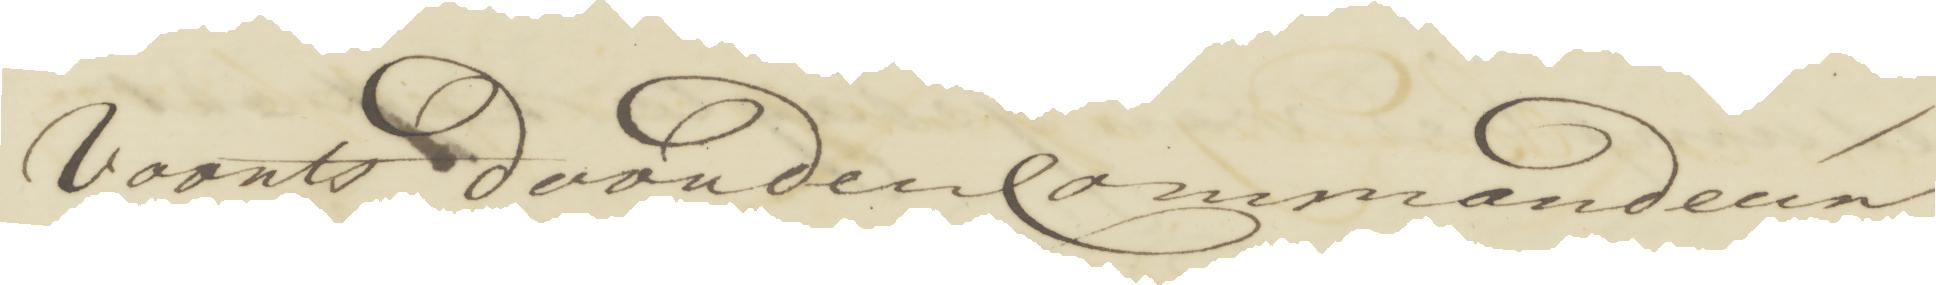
voorts door den commandeur
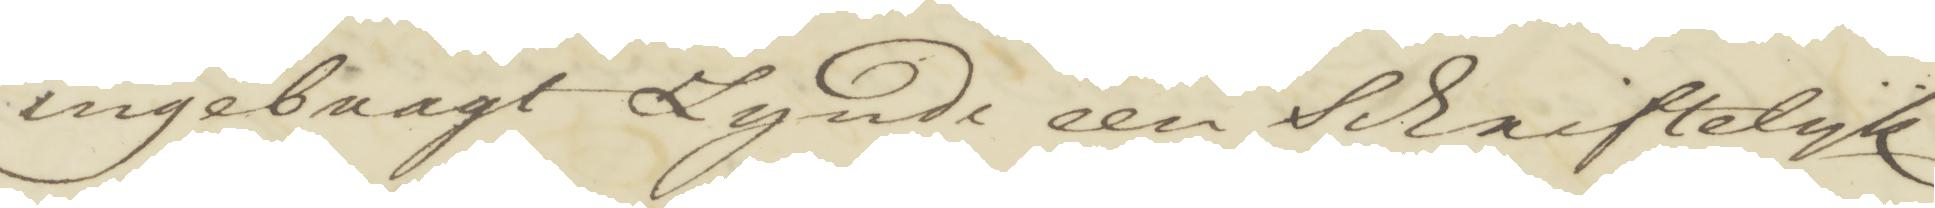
ingebragt zynde een schriftelijk
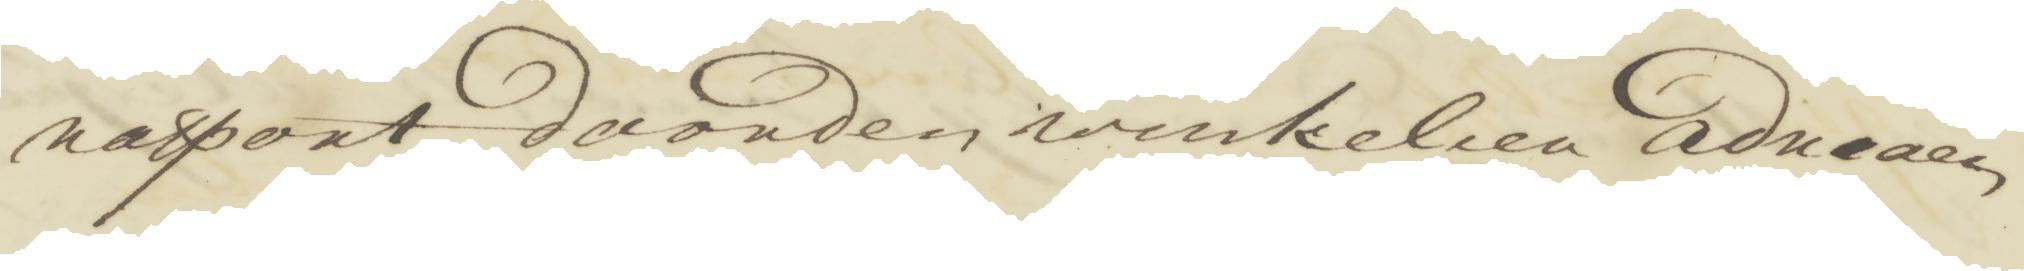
rapport doorden winkelier adriaen
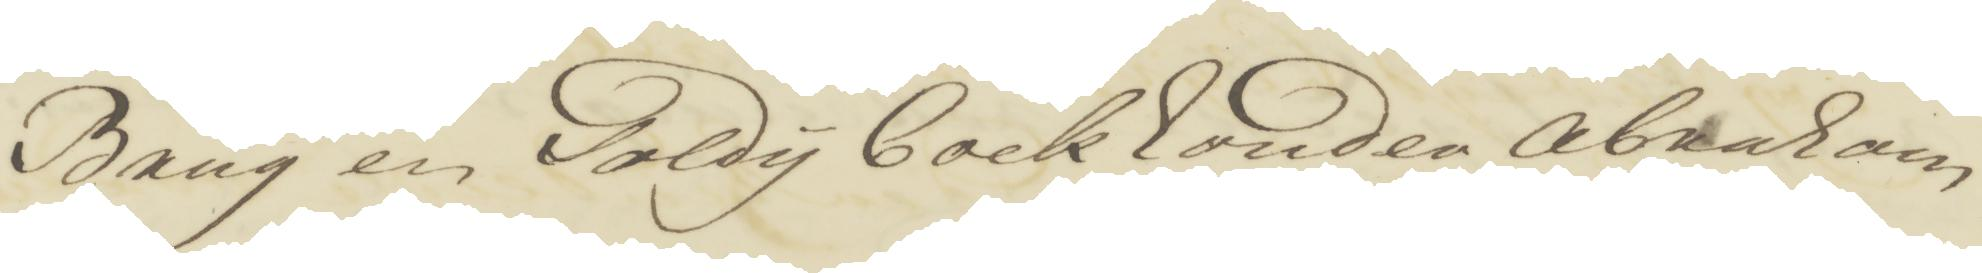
Brug en soldij boekhouder abraham
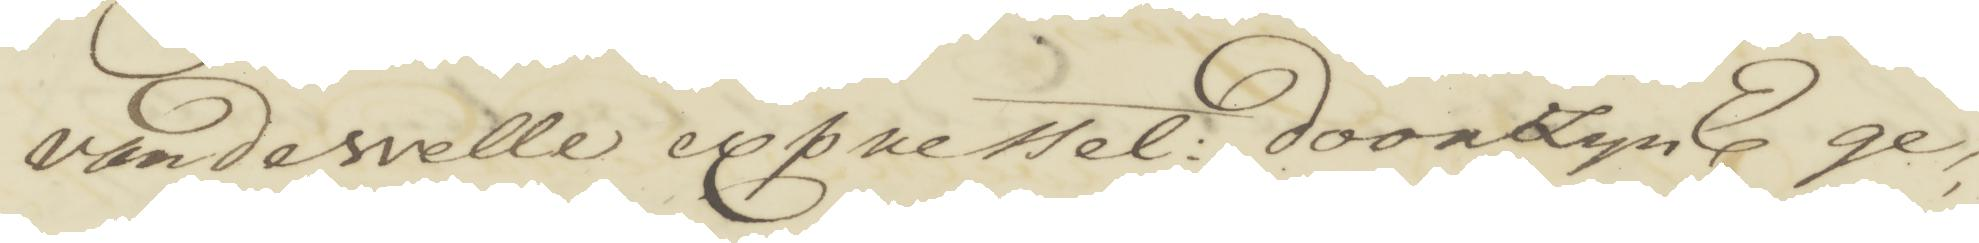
van de welle expresselijk door zyn E ge„
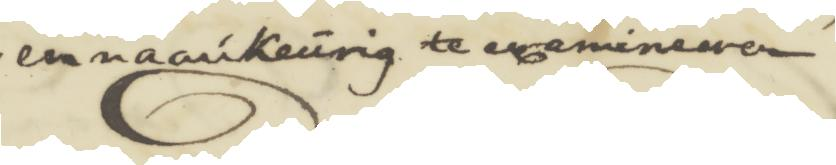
en naaukeurig te exemineeren
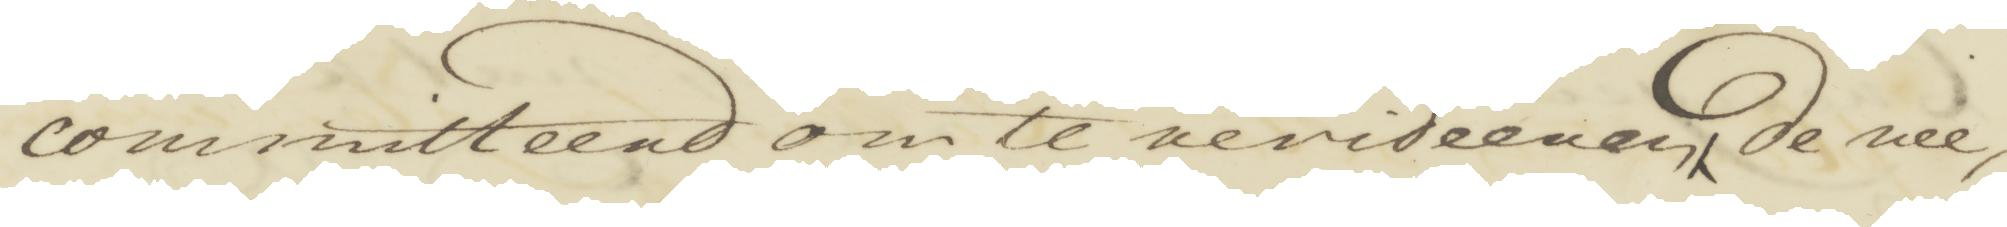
committeerd om te revideeren ^ de ree
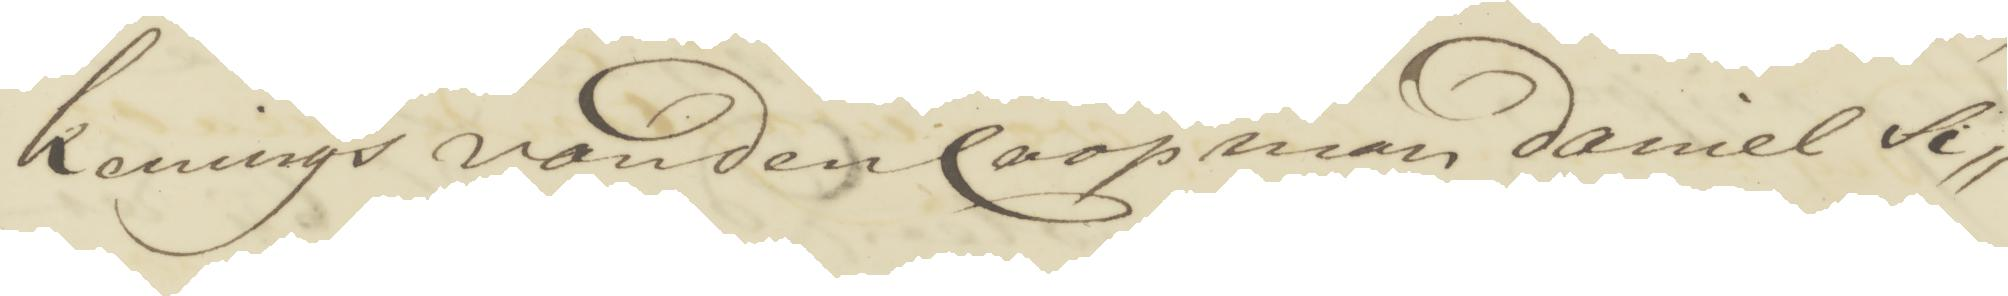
kenings van den Coopman daniel si„
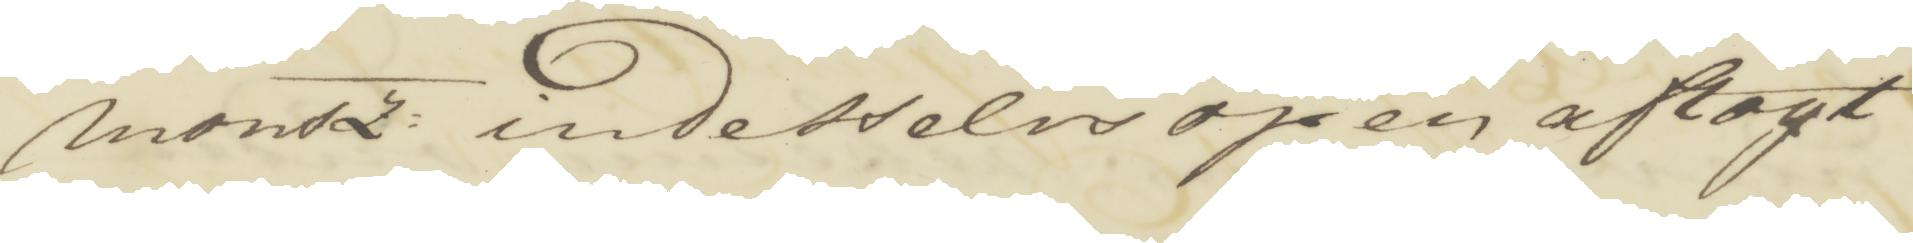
monsz: in desselvs op en aftogt
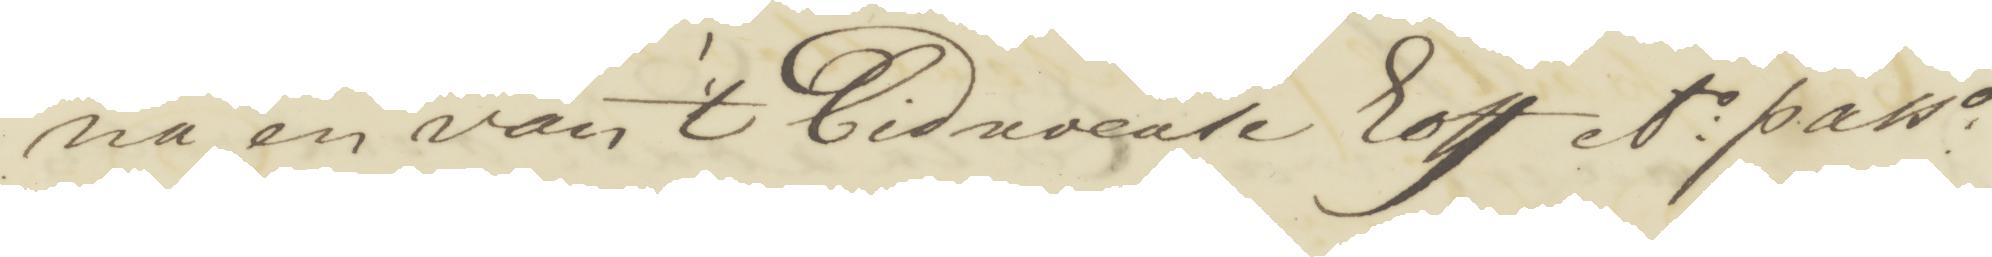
na en van ’t bidroease hoff A:o pass:o
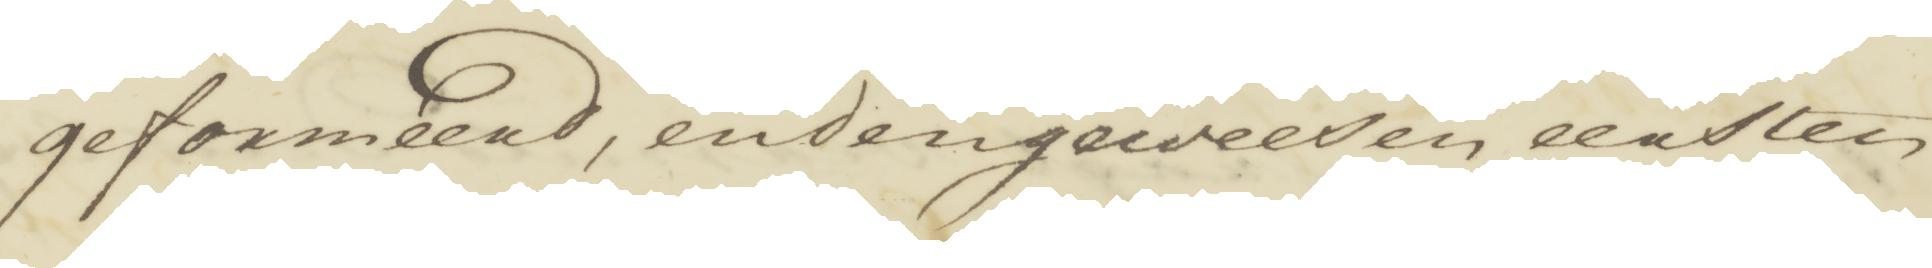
geformeerd, en den geweesen eersten
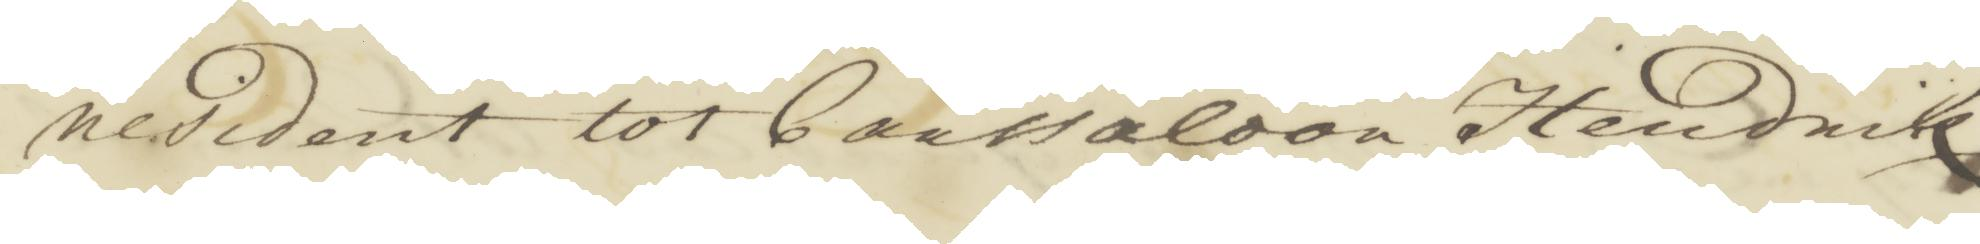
resident tot barssaloor Hendrik
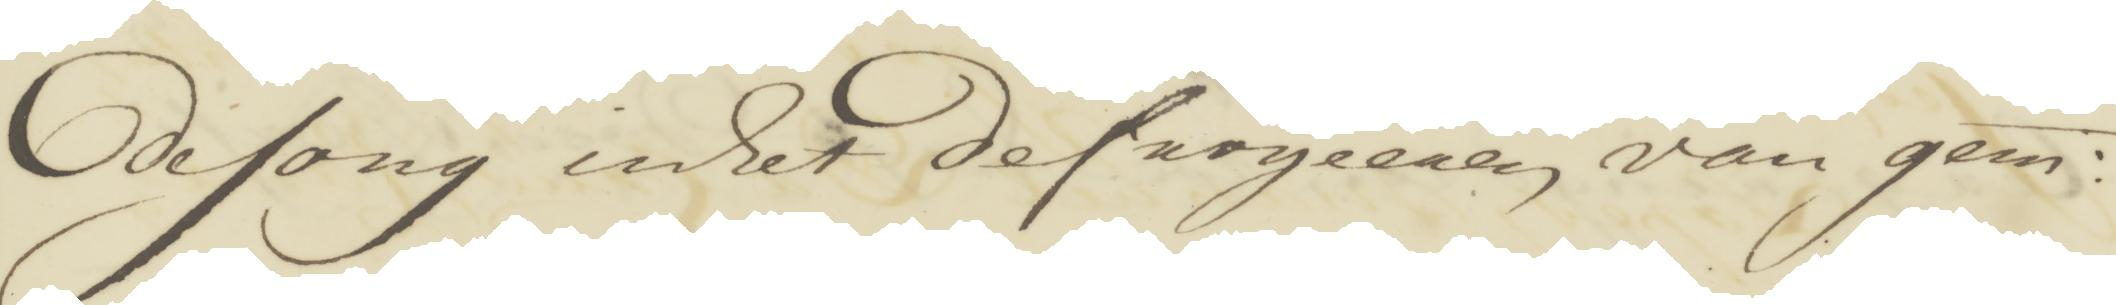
de Jong in het defroijeeren van gem:
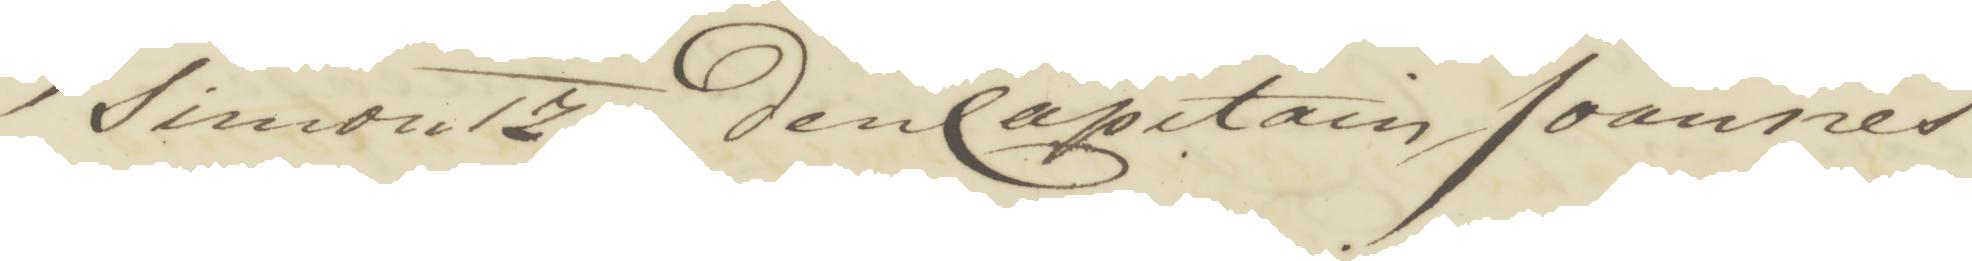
simonsz:, den Capitain Joannes
